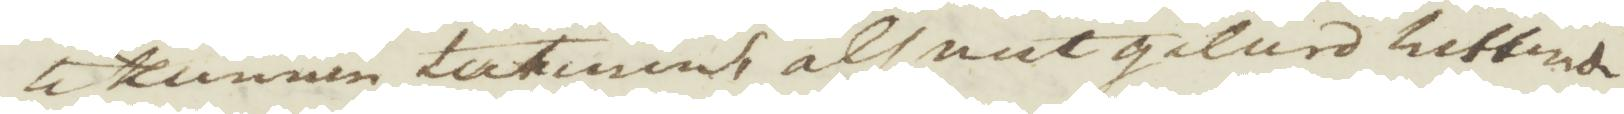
te kunnen teekenen, als niet geleerd hebbende
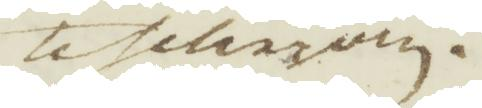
te schryven.
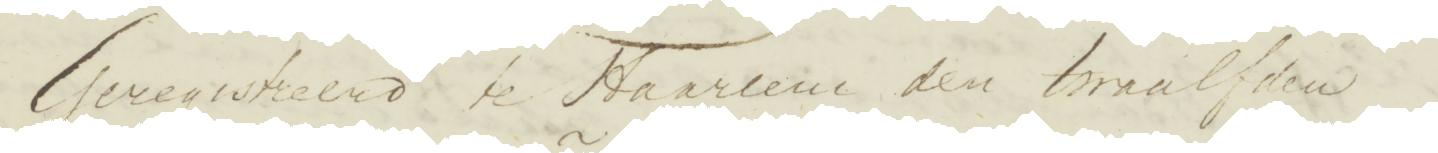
Geregisteerd te Haarlem den twaalfden
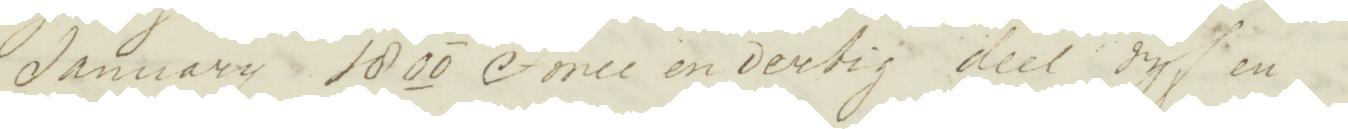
Ianuary 1800 Twee en dertig deel vyf en
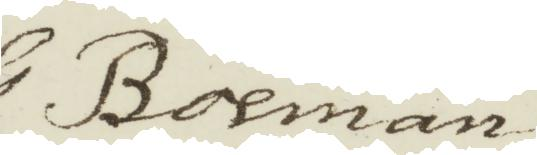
G Bolman
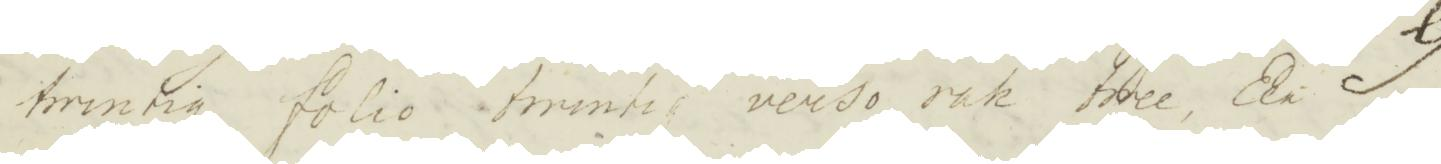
twintig folio twintig verso vak twee, Een
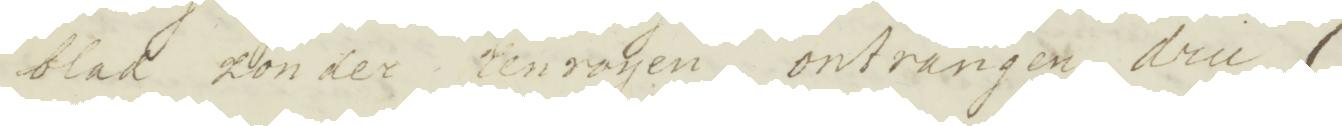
blad zonder renvoyen ontvangen drie
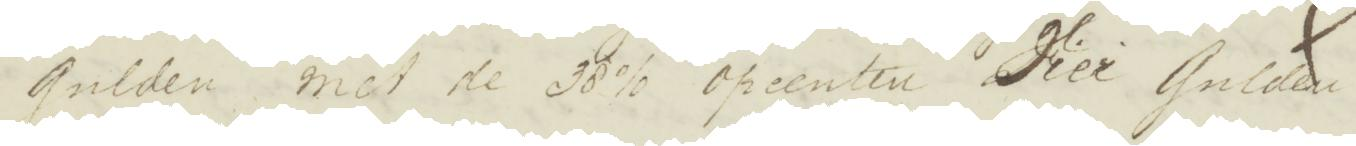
Gulden met de 38% opcenten Vier Gulden
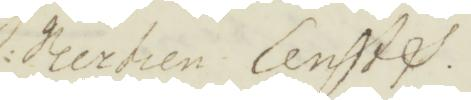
: Veertien Cents.
